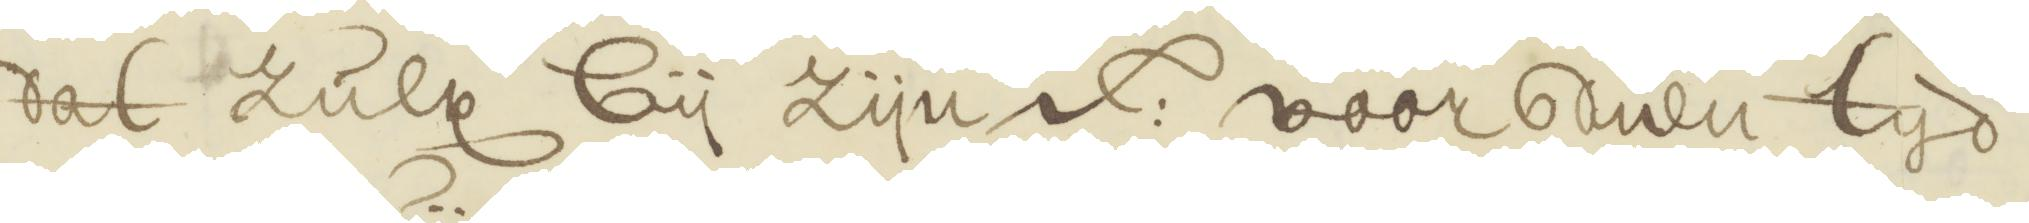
dat zulx bij zijn E: voor dien tijd
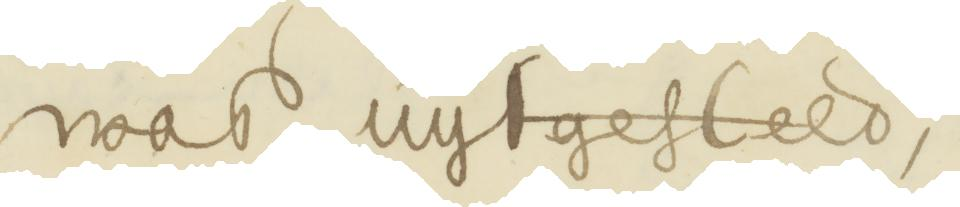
was uijtgesteld;
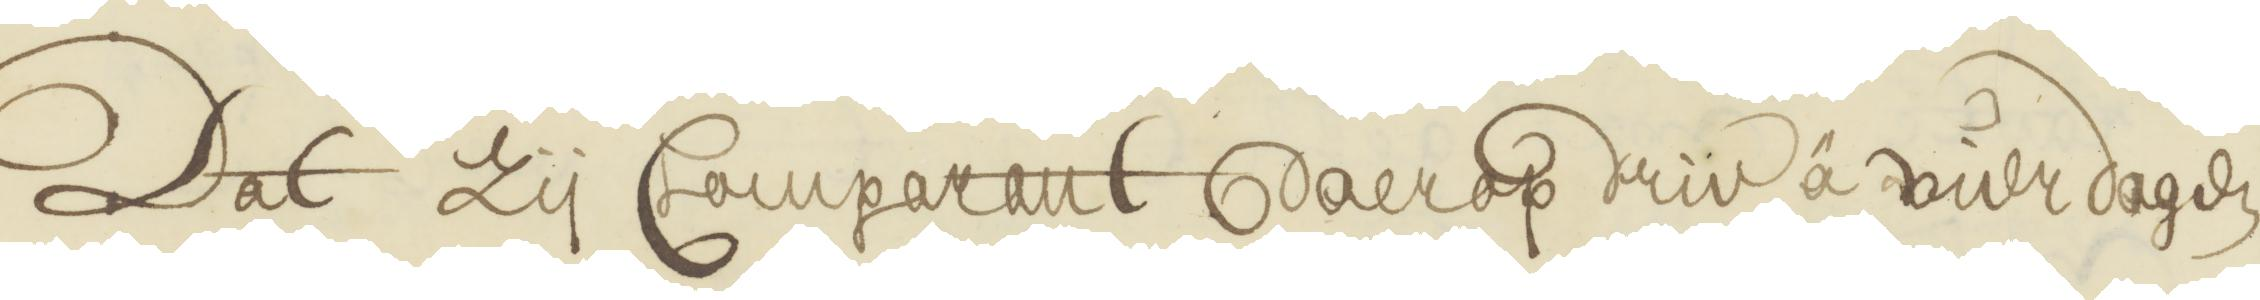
Dat zij Comparant daerop drie ä vier dagen
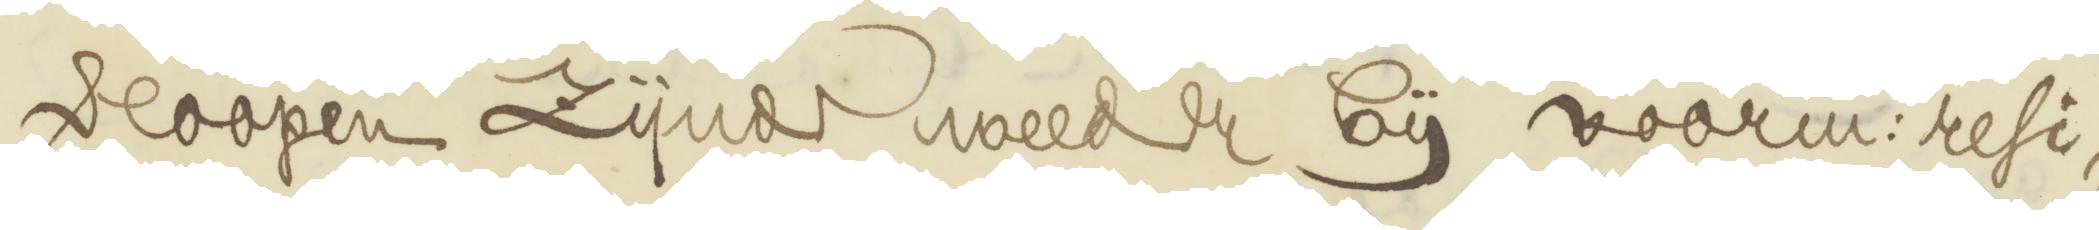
vercoopen zijnde weeder bij voorm:te resi„
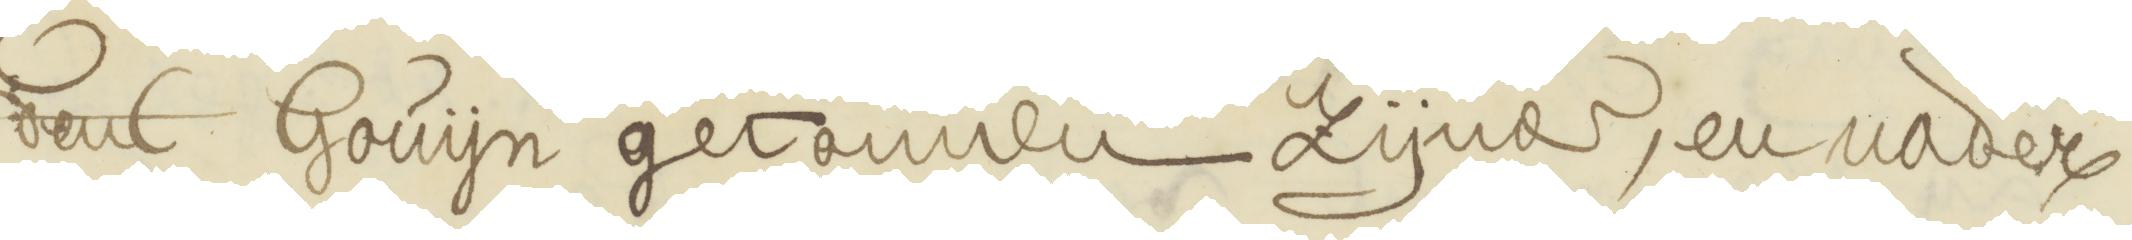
dent Gouijn gecomen zijnde, en nader
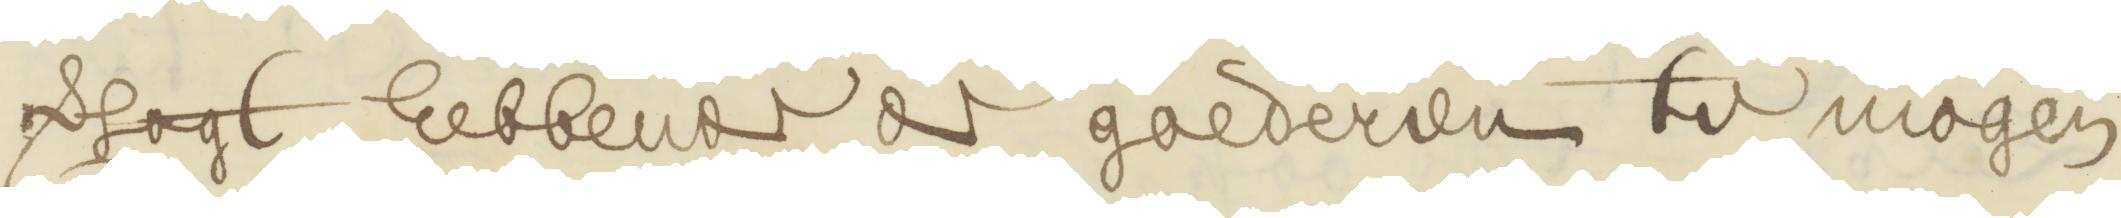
versogt hebbende de goederen te mogen
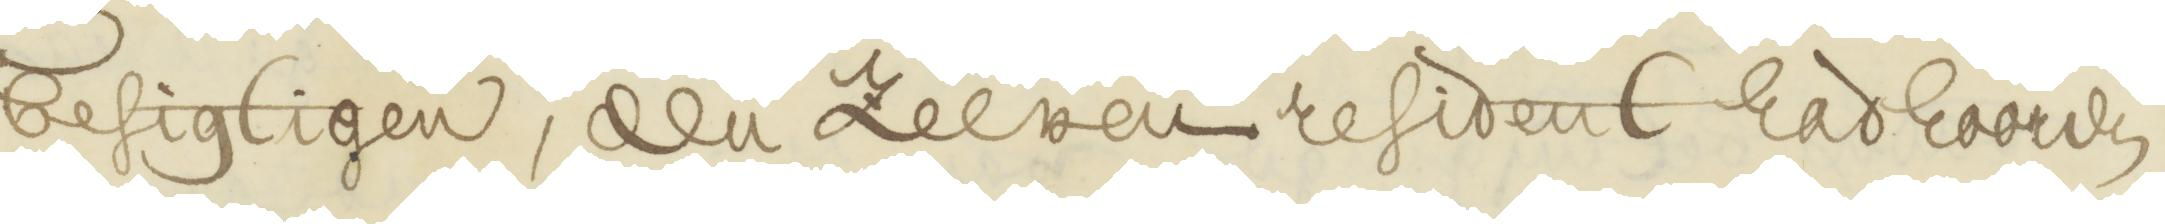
besigtigen, den zelven resident had hooren
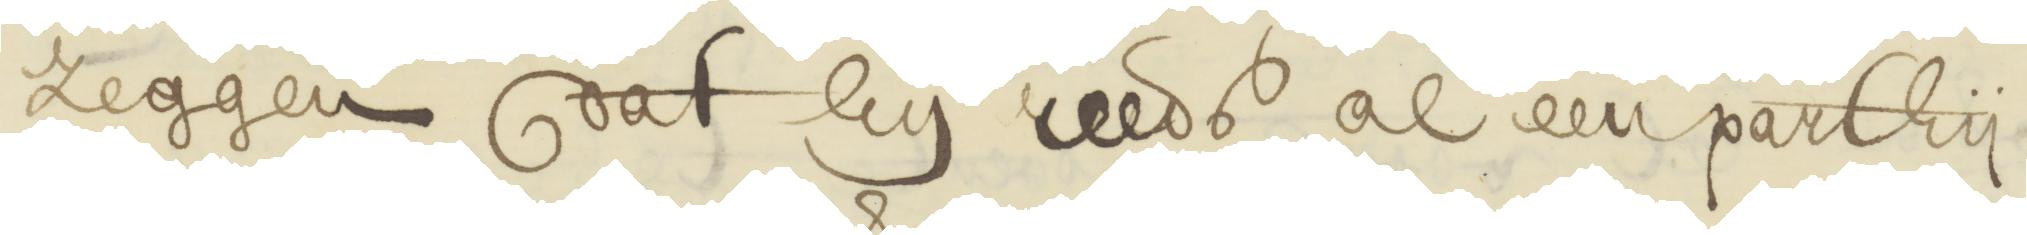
zeggen dat hij reeds al een parthij
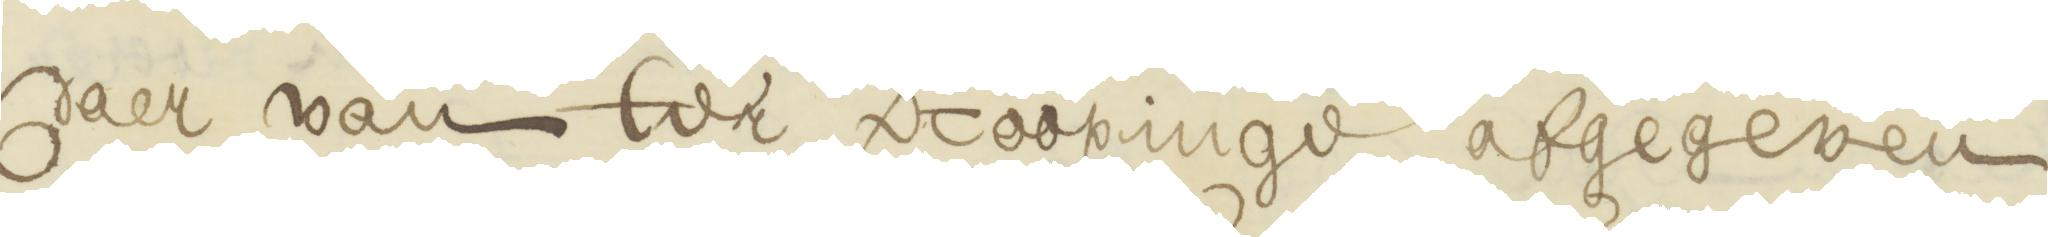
daer van ter vercoopinge afgegeven
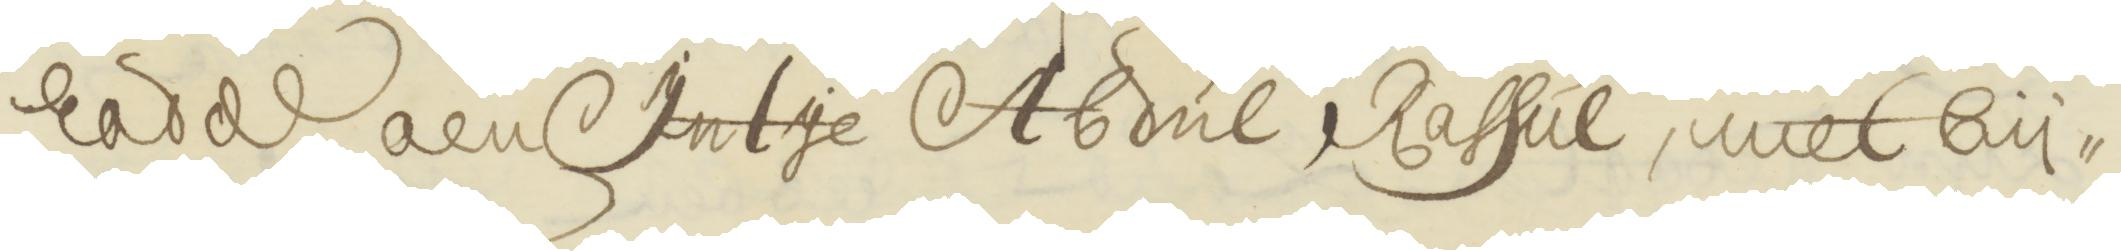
hadde aen Intje Abdul Rassul, met bij„
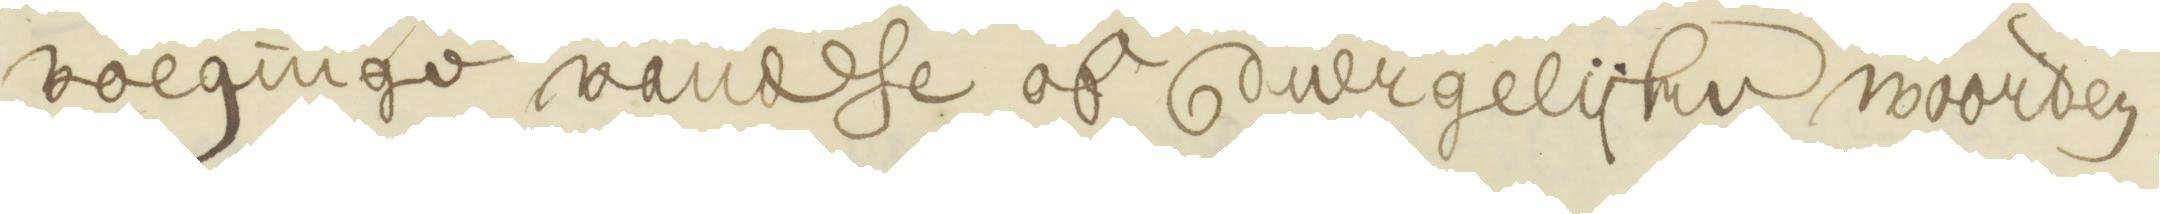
voeginge vandese of diergelijke woorden
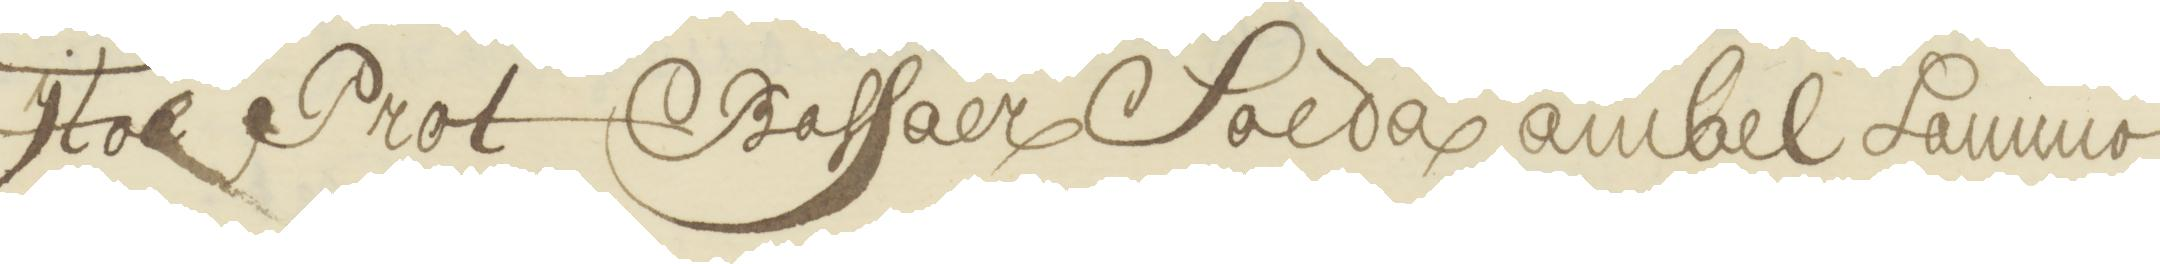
Hol Prot Bassaer Soeda ambel Lammo
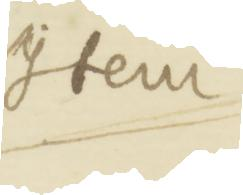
Jtem
